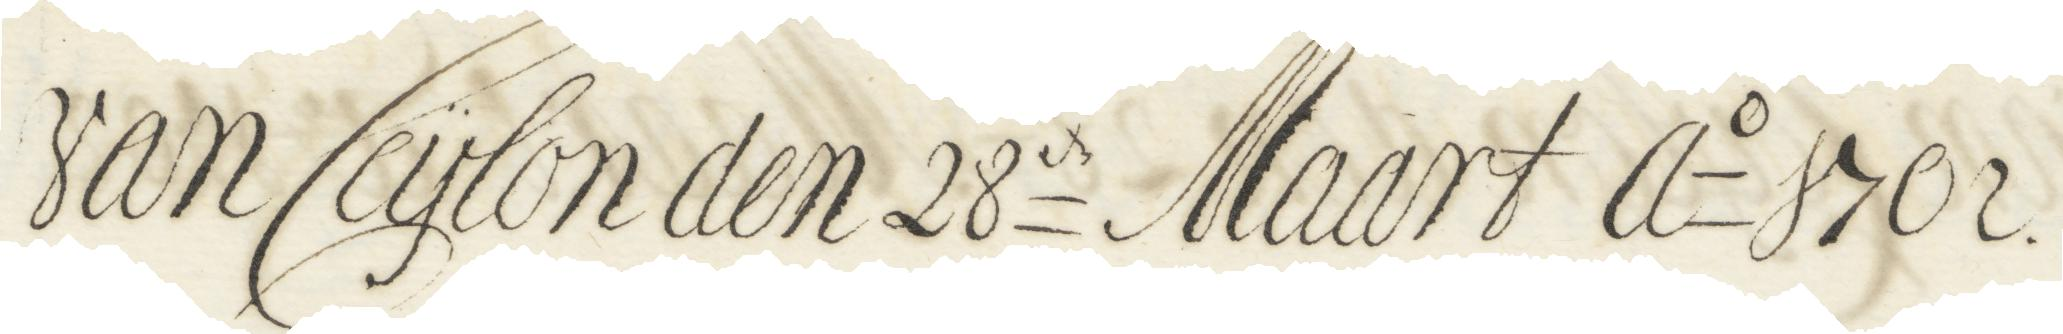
Van Ceijlon den 28=en Maart A=o 1702.
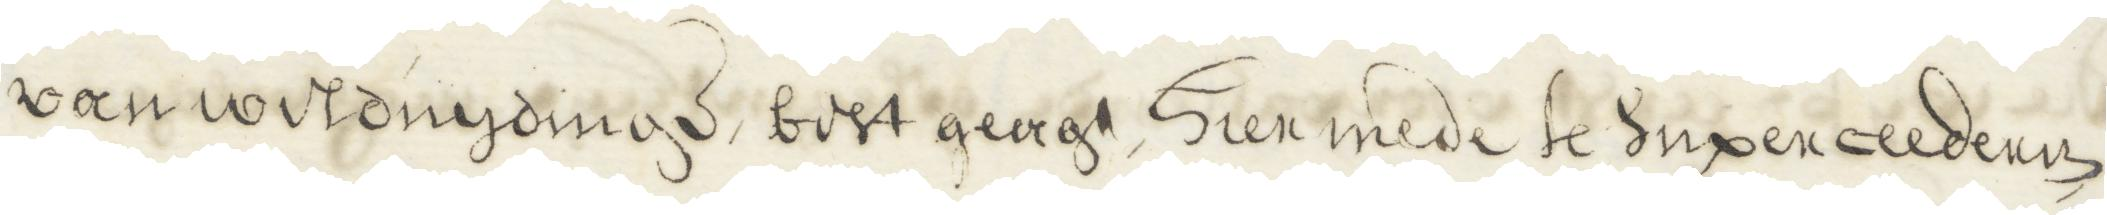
van welduydings, best geagt, hier mede te superceederen
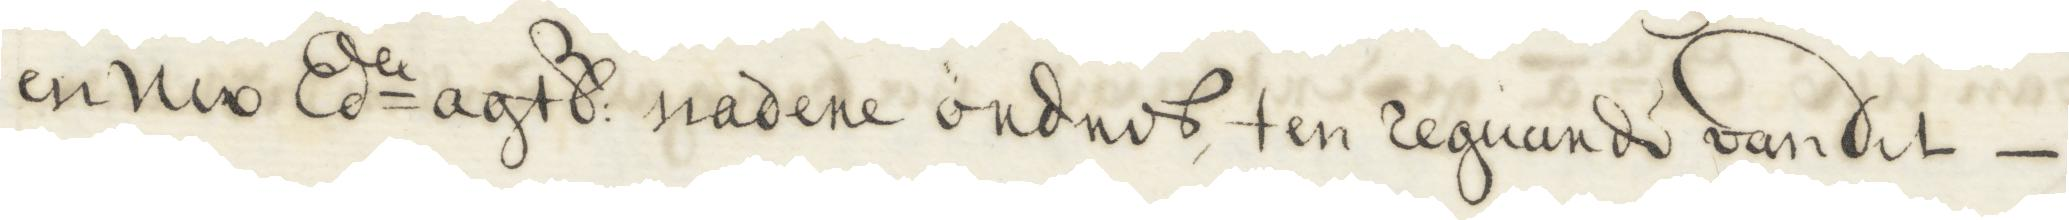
en Uw Ed=le agtb: nadere ordres ten reguarde van dit —
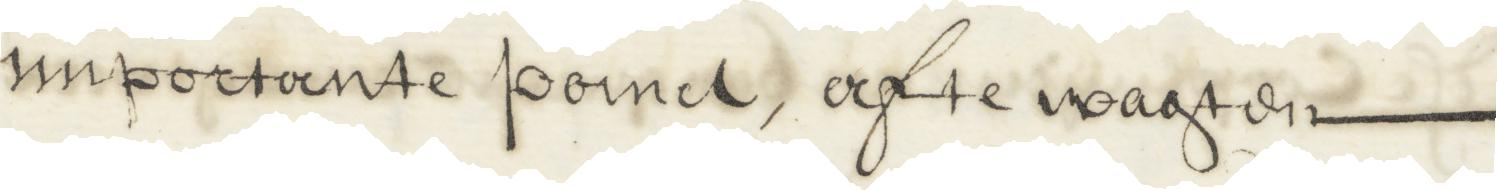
importante poinct, af te wagten
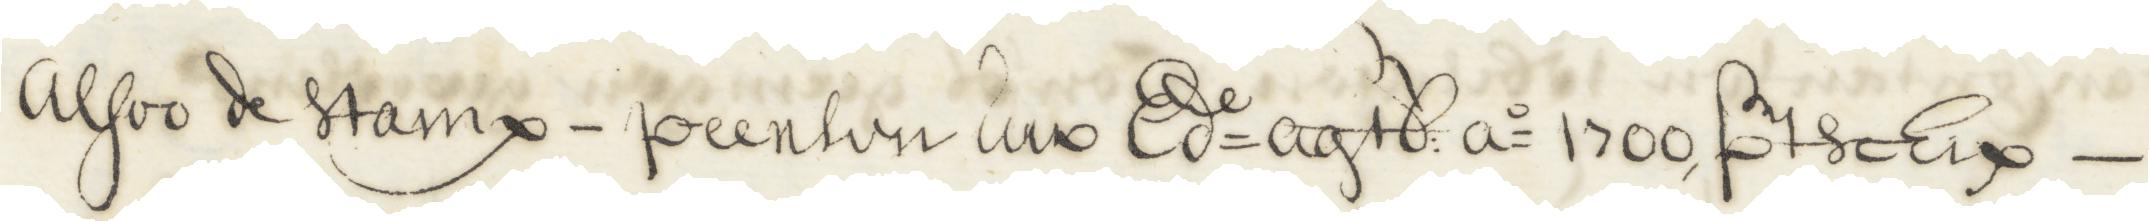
Alsoo de stamp - peerlen uw Ed=e agtb: a=o 1700, prt schip —
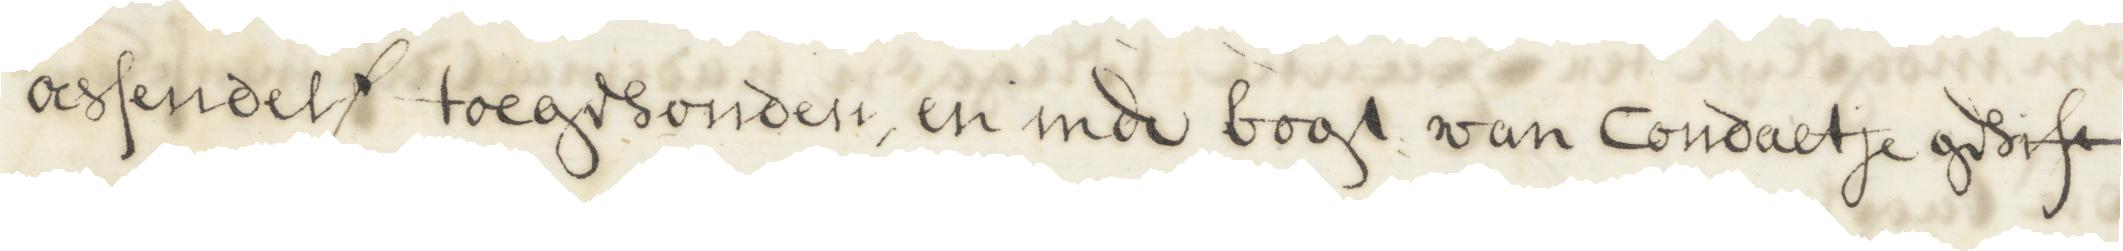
assendelf toegesonden, en inde boot van Condaetje gesift
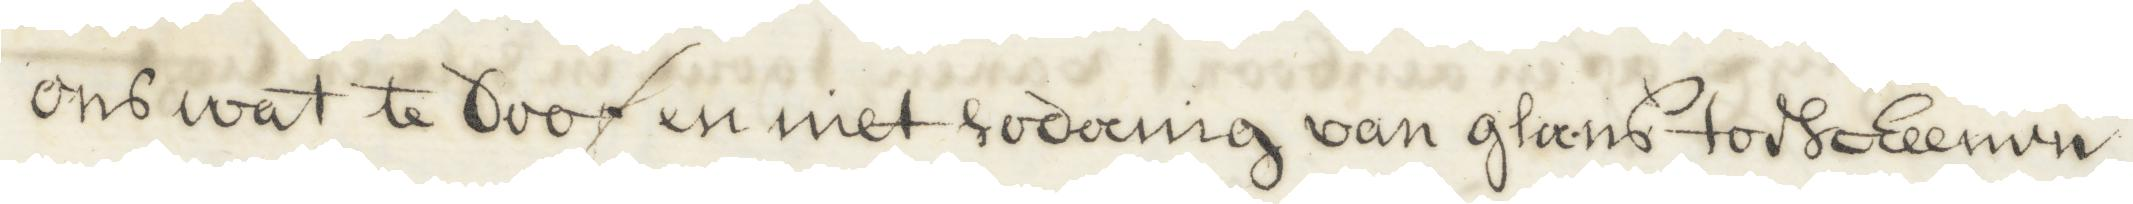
ons wat te doof en niet sodanig van glans toescheenen
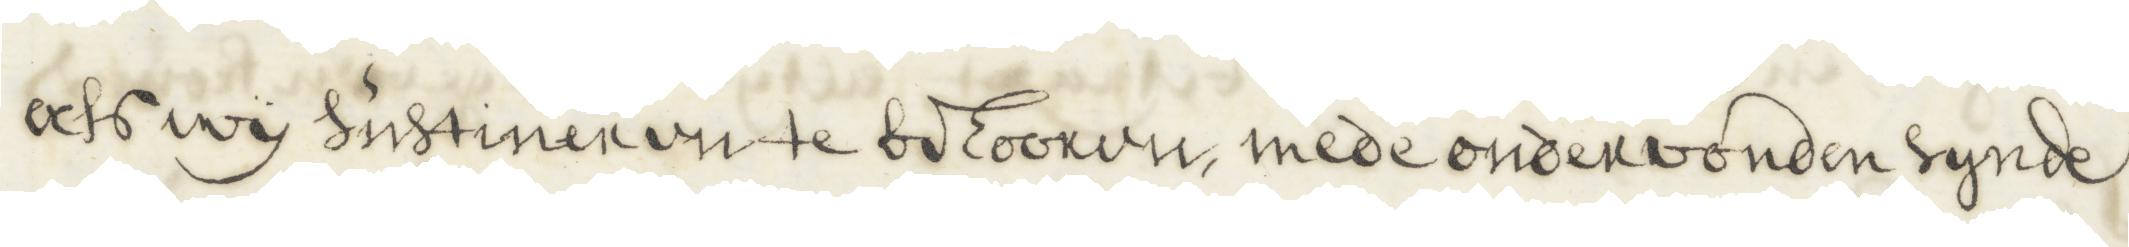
als wij sustineren te behooren, mede ondervonden synde
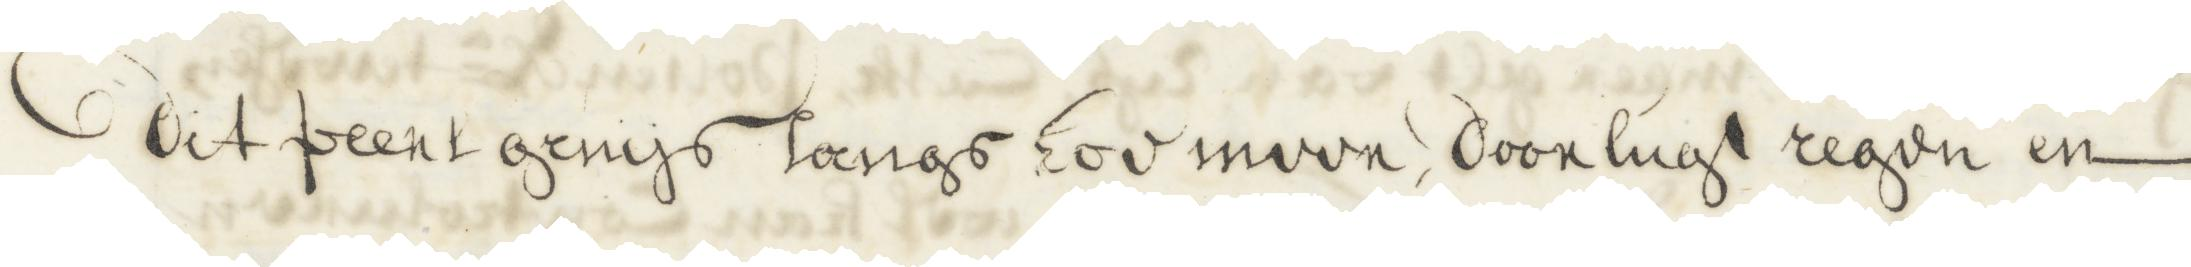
dit peerl gruijs langs hoe meer, door lugt regen en
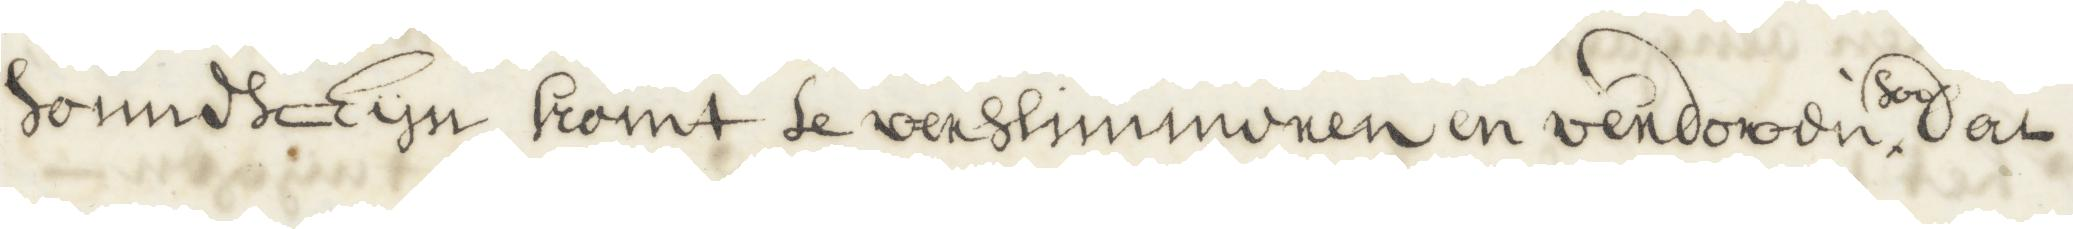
sonneschijn komt te verslimmeren en verdoven ^ soo dat
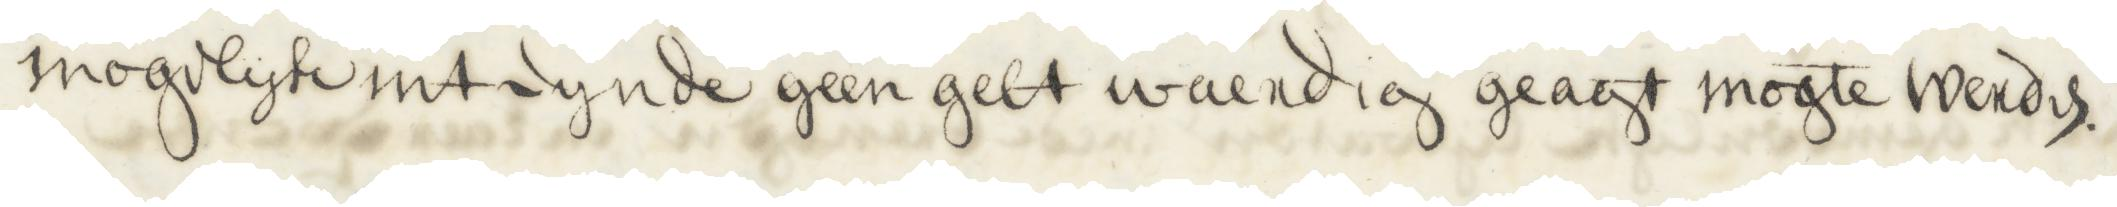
mogelijk int eynde geen gelt waerdig geagt mogte werden.
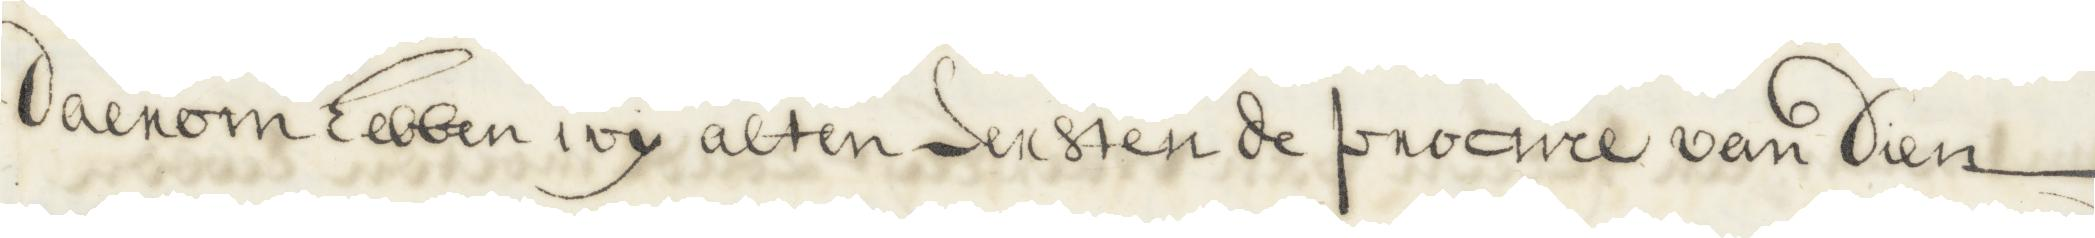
daerom hebben wy alten Eersten de procure van dien
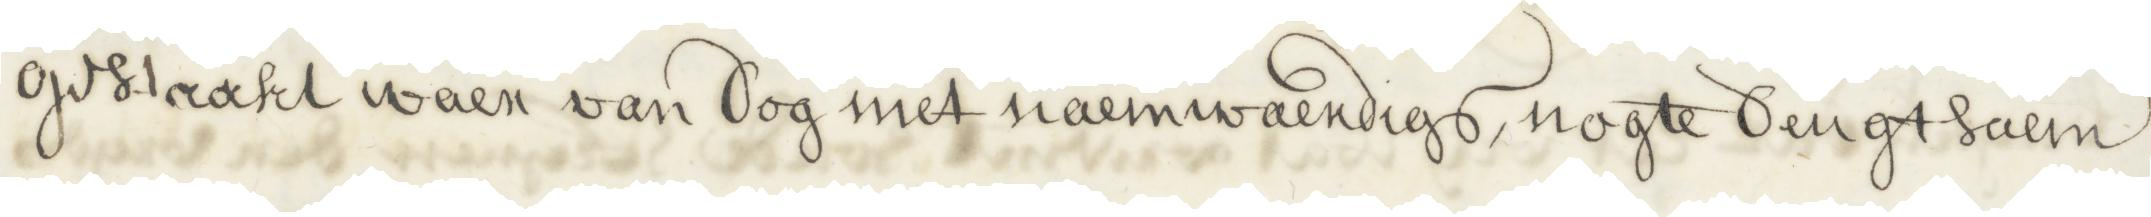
gesaakt waer van dog niet naemwaerdigs, nogte deugtsaem
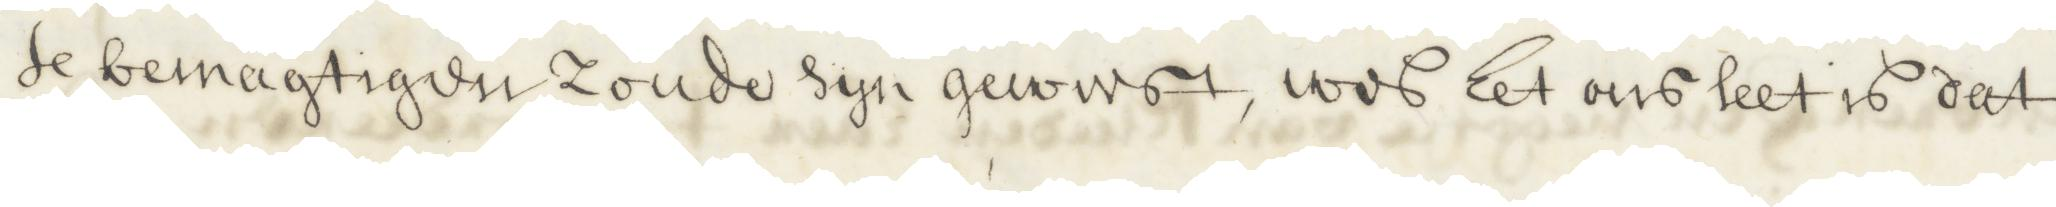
te bemagtigen zoude sijn geweest, wes het ons leet is dat
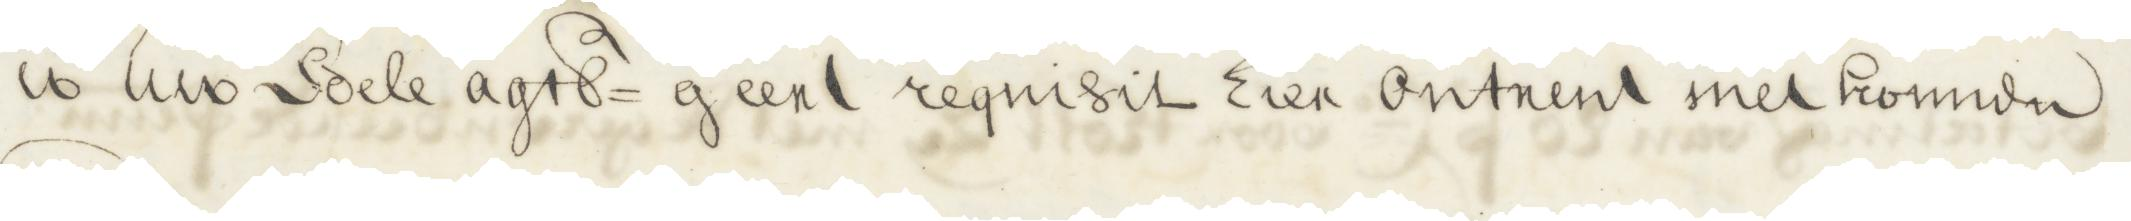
w' uw Edele agtb= g' eert requisit hier ontrent niet konnen
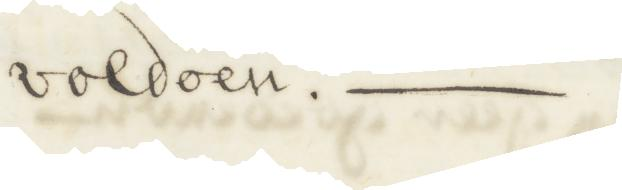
voldoen.—
